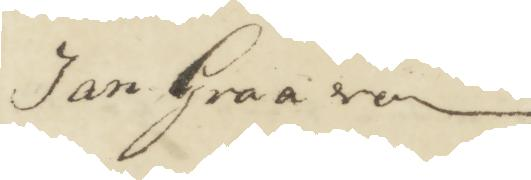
Jan Graaven
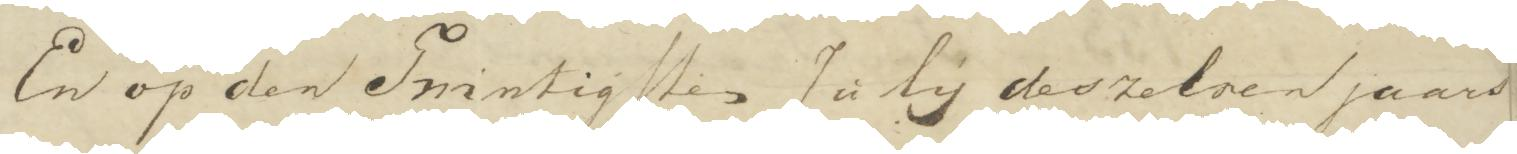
En op den Twintigsten Julij deszelven jaars
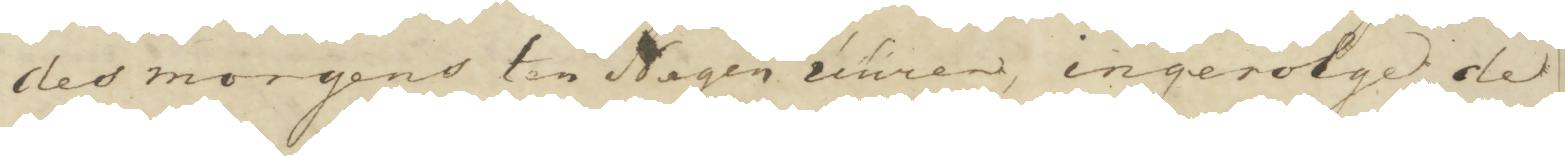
des morgens ten Negen uuren, ingevolge de
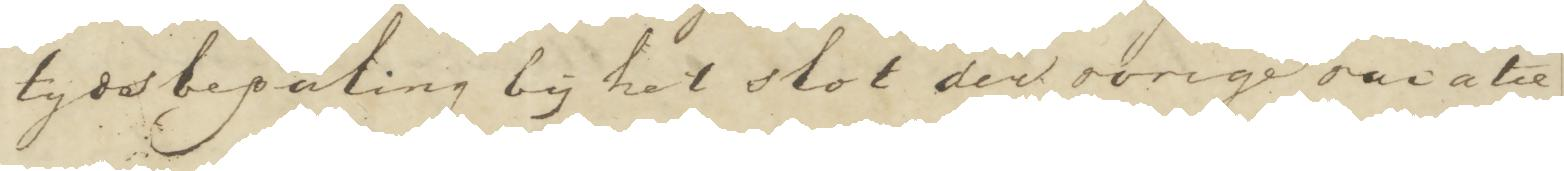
tijdsbepaling bij het slot der vorige vacatie
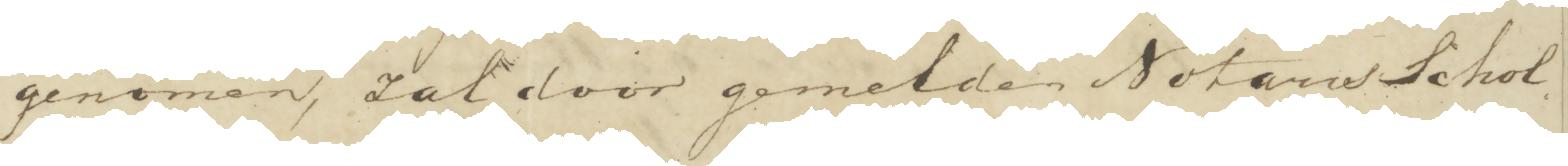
genomen, zal door gemelden Notaris Schol
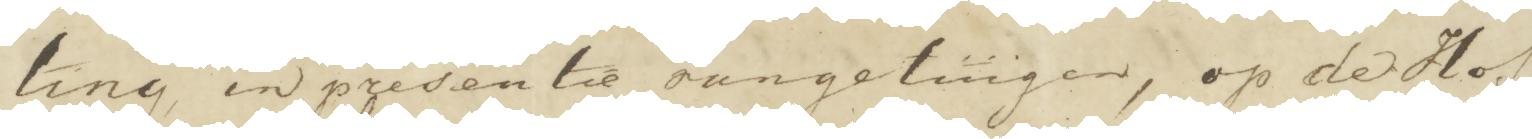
ting, in presentie van getuigen, op de Hof-
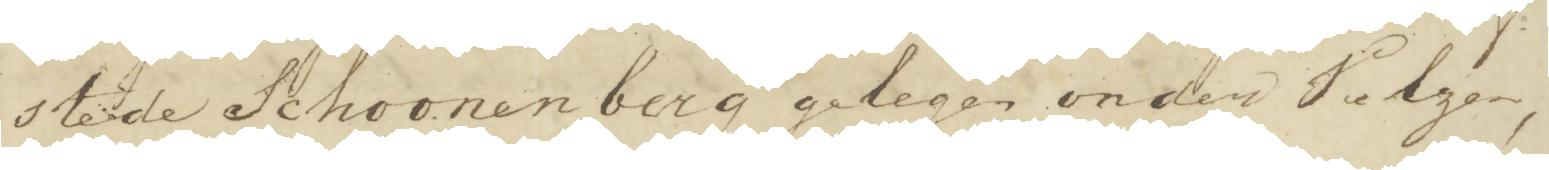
stede Schoonenberg gelegen onder Velzen,
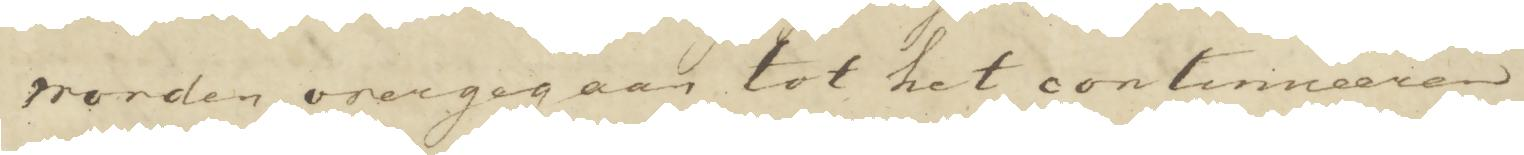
worden overgegaan tot het continueeren
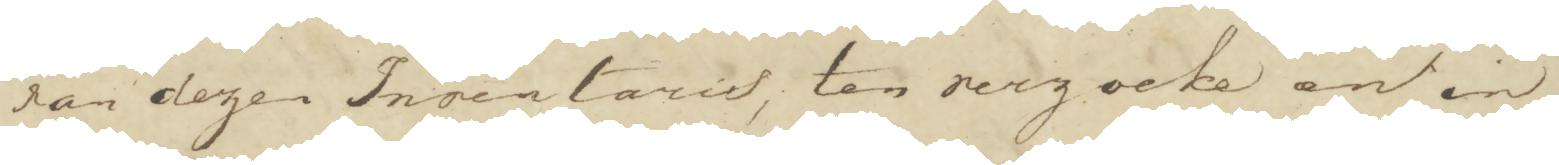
van dezen Inventaris, ten verzoeke en in
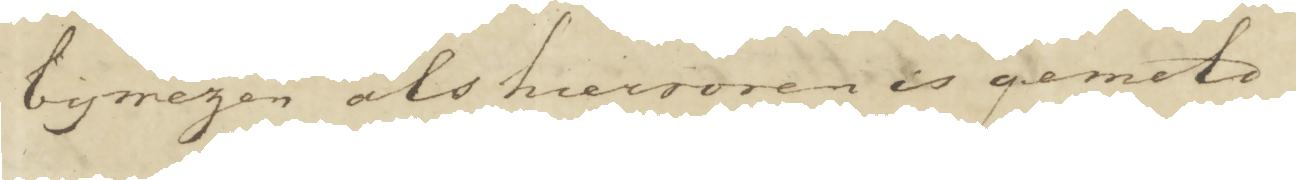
bijwezen als hiervoren is gemeld.
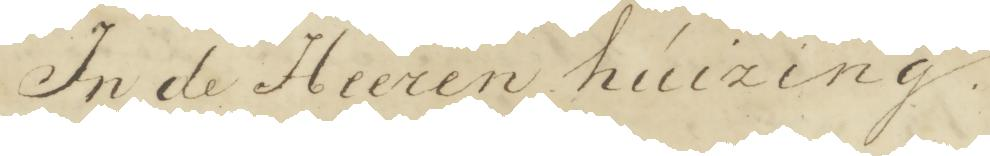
In de Heeren huizing.
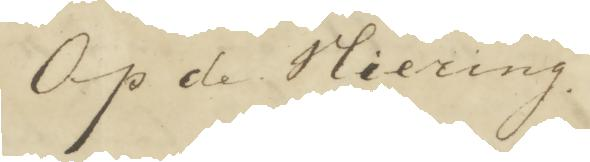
Op de Vliering.
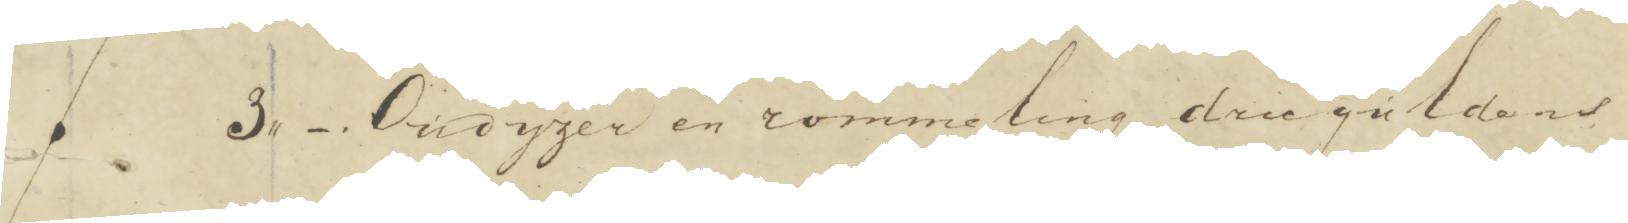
ƒ 3„ -. Oudijzer en rommeling drie guldens
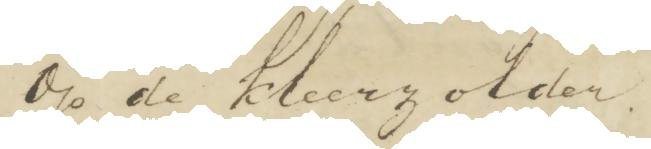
Op de kleerzolder
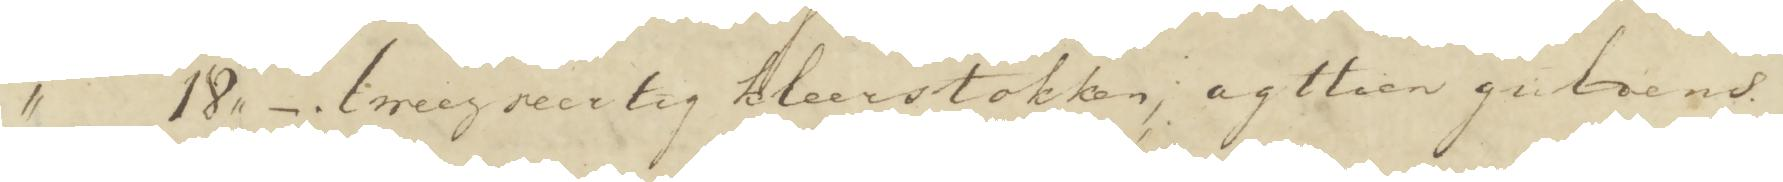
„ 18„ -. tweeen veertig kleerstokken, agttien guldens.
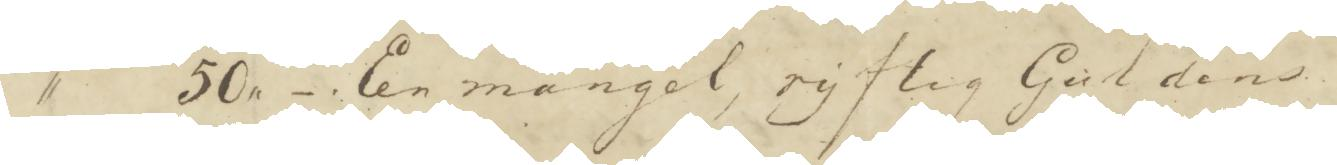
„ 50„ -. Een mangel, vijftig Guldens
